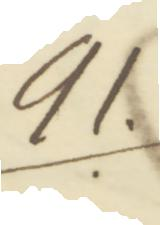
391.
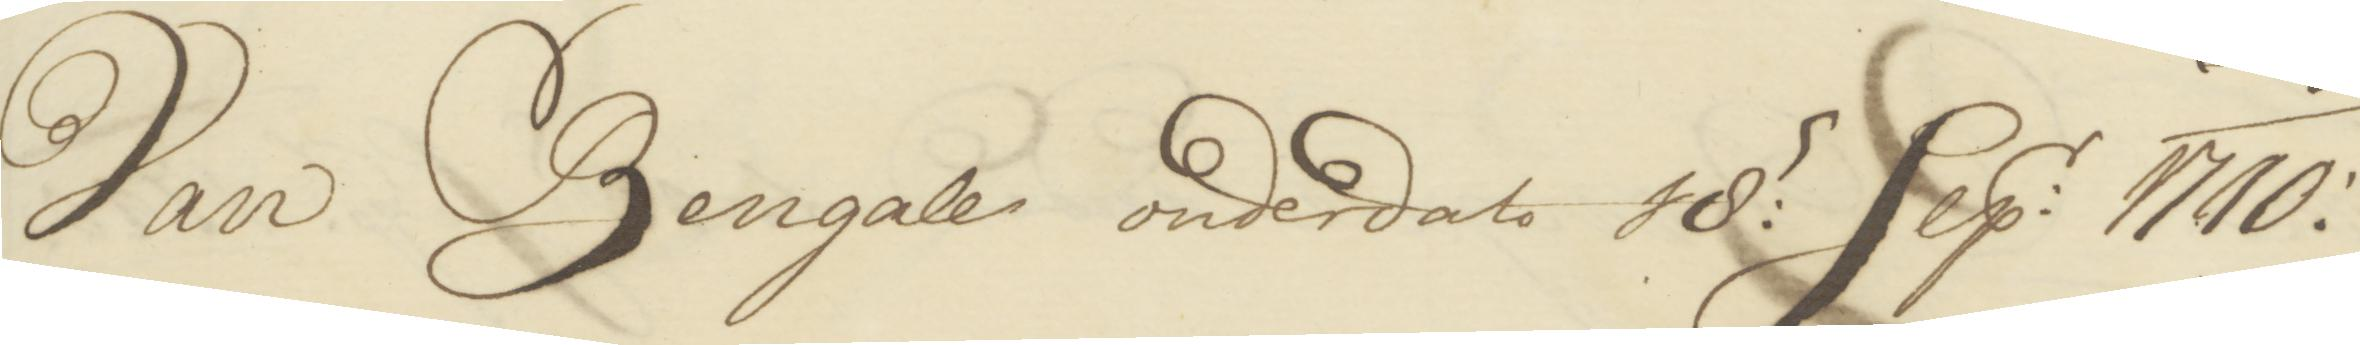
Van Bengale onderdato 18:' Sep:r 1740:
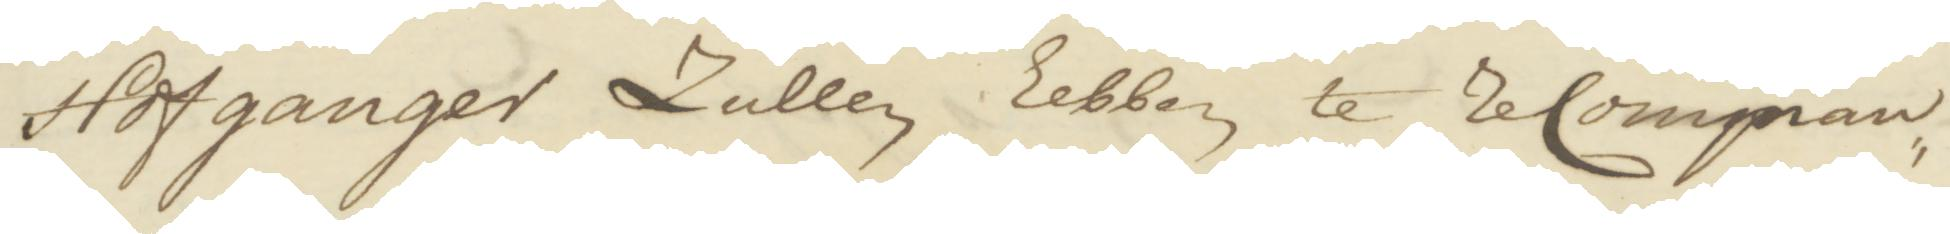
Hofganger zullen hebben te recomman„
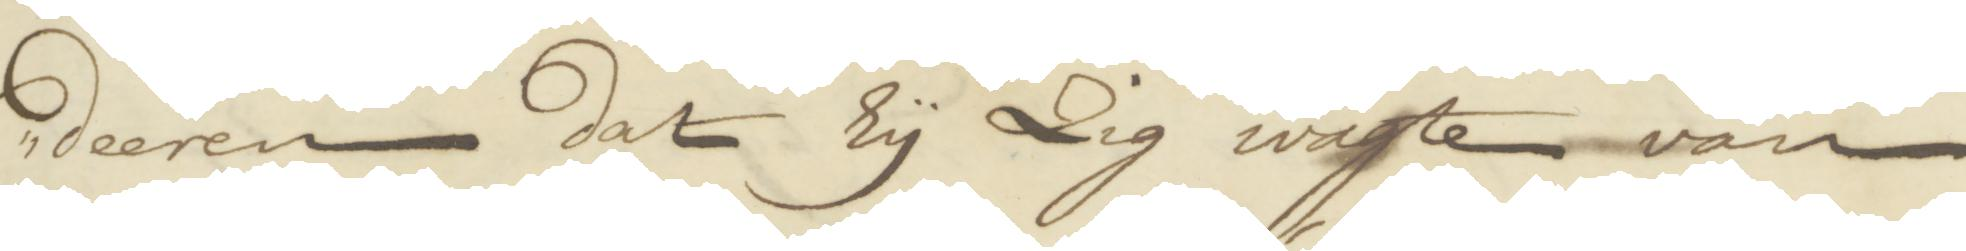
„deeren dat hij zig wagte van
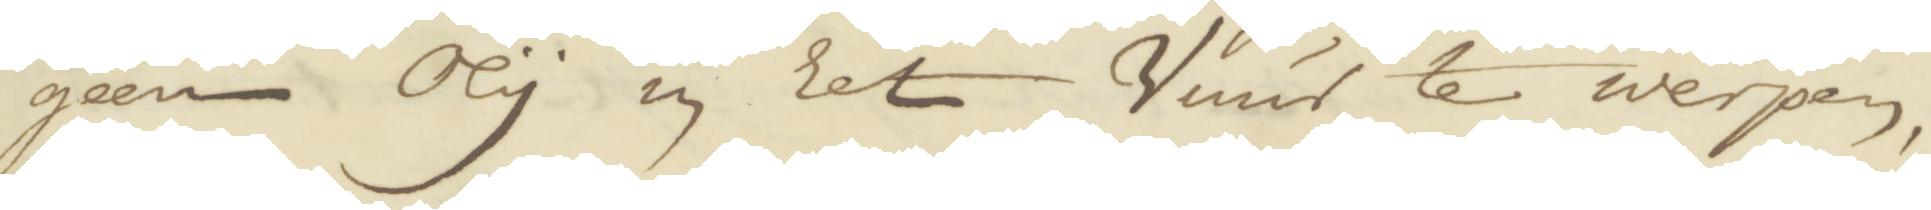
geen olij in het Vuur te werpen,
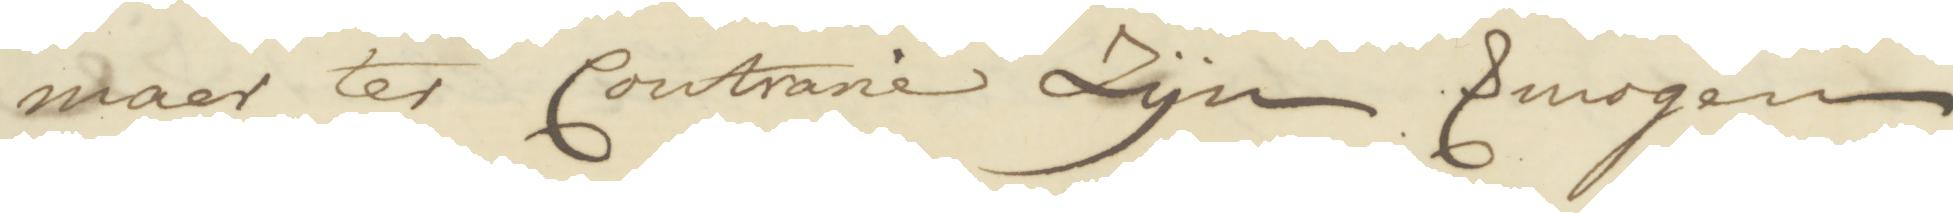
waer ter contrarie zijn vermogen
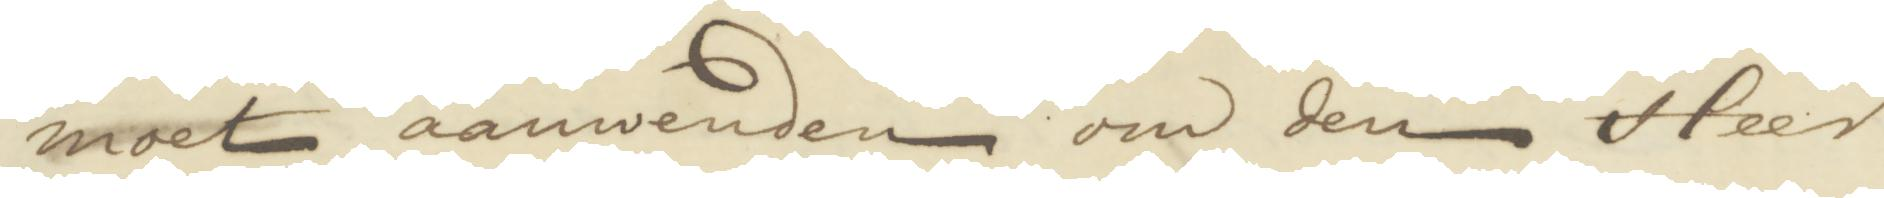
moet aanwenden om den Heer
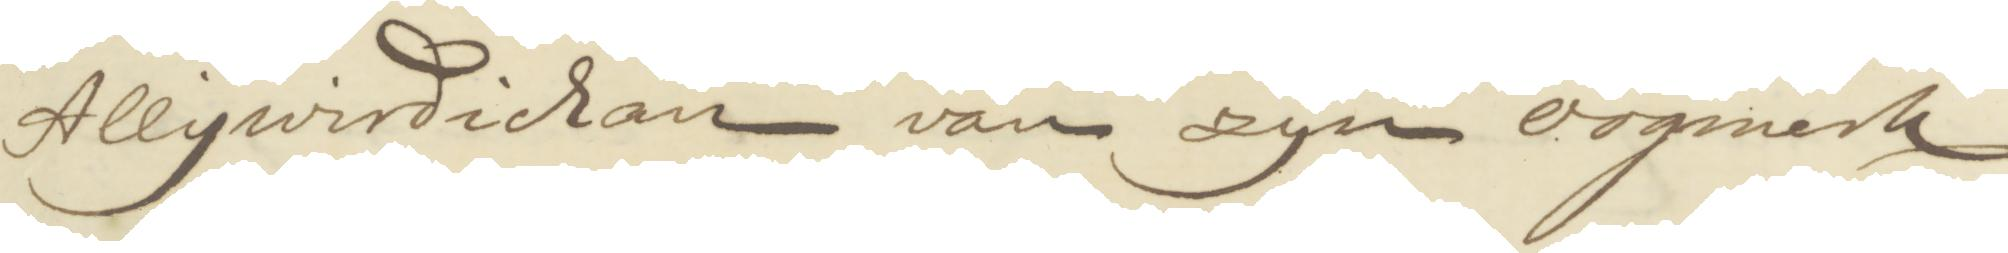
Allijwirdichan van zijn oogmerk
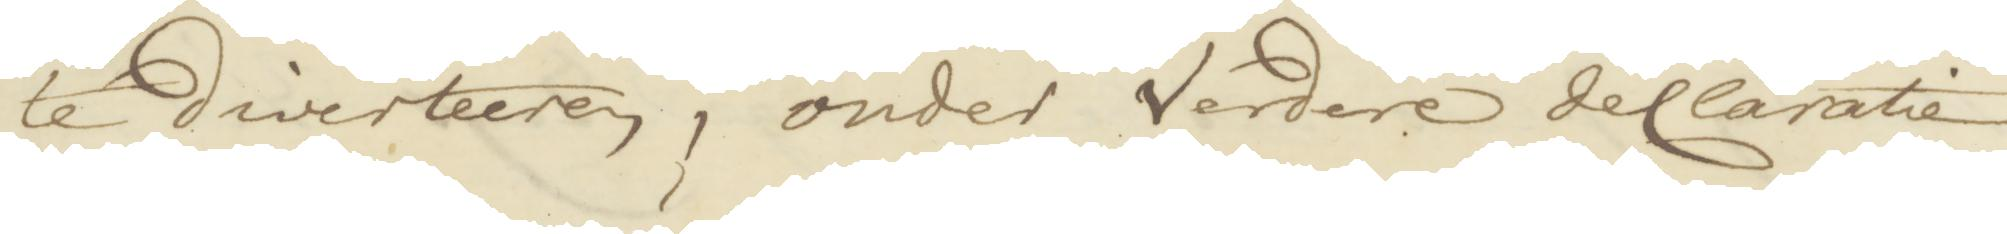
te diverteeren, onder verdere declaratie
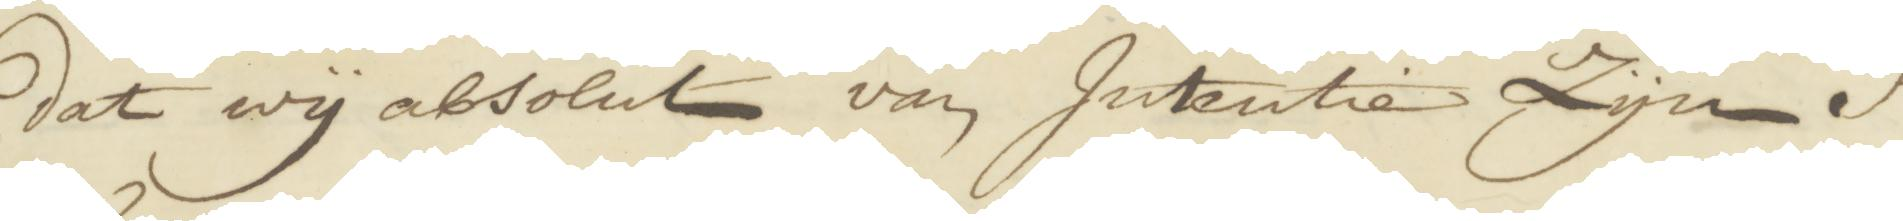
dat wij absolut van Jntentie zijn 's
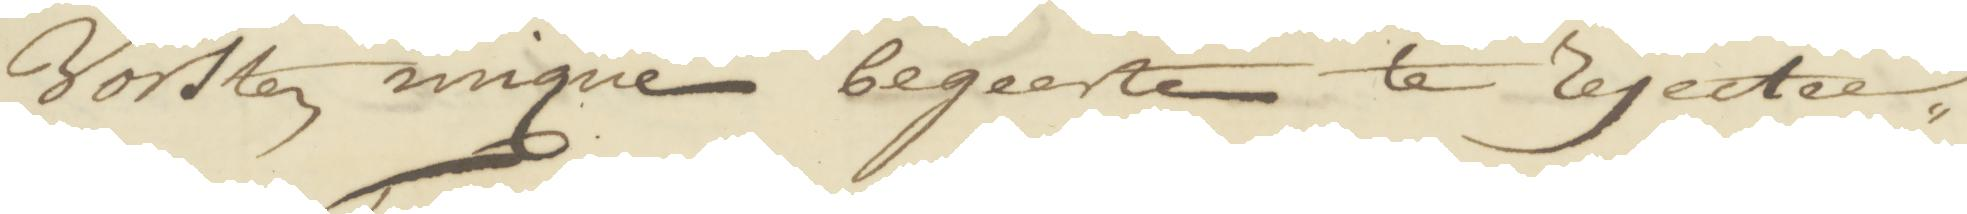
Vorsten inique begeerte te rejectee„
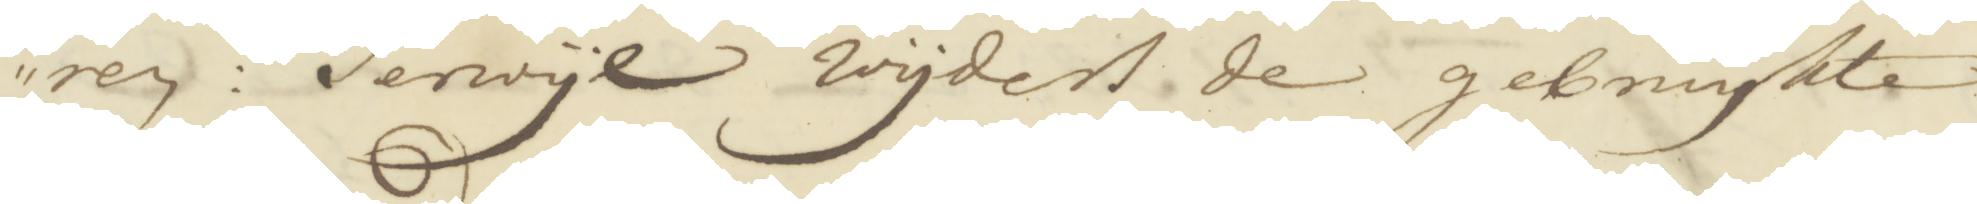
„ren: Terwijl wijders de gebruijkte
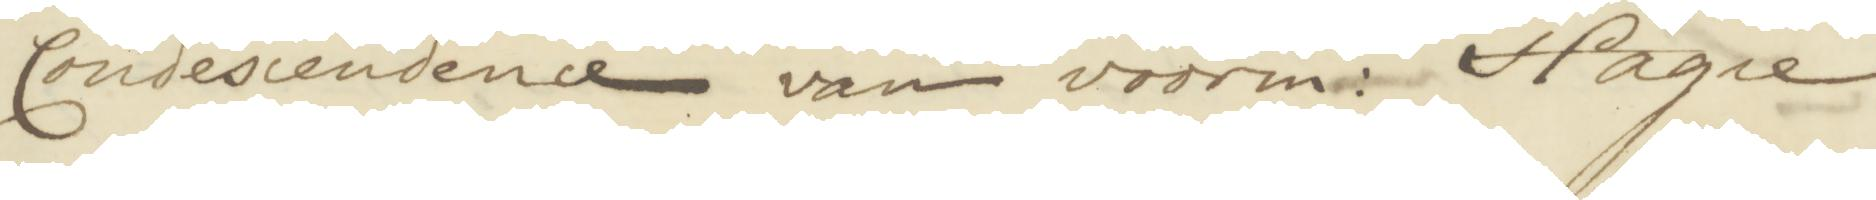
condescendence van voorm: Hagie
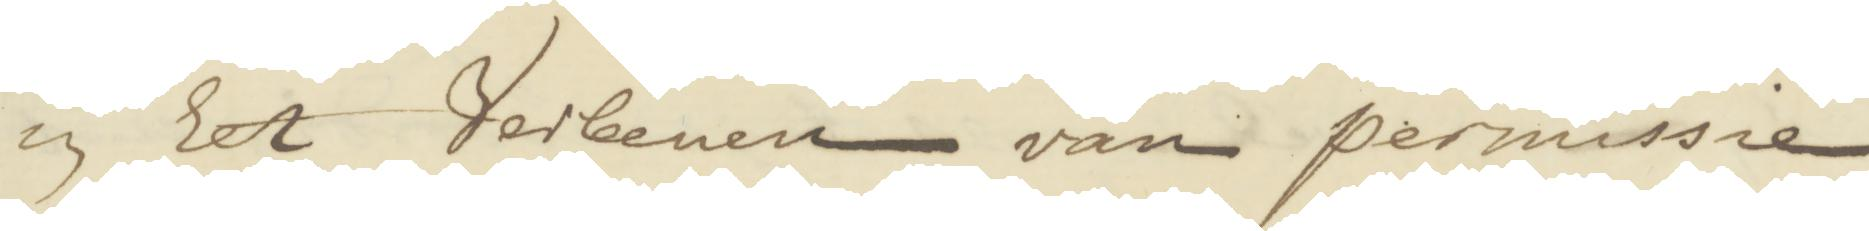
in het Verleenen van permissie
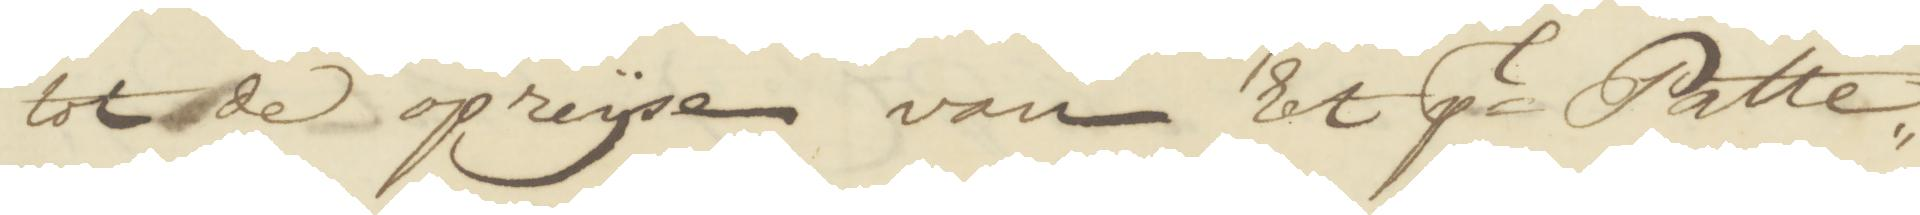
tot de op reijse van het p=l Patte„
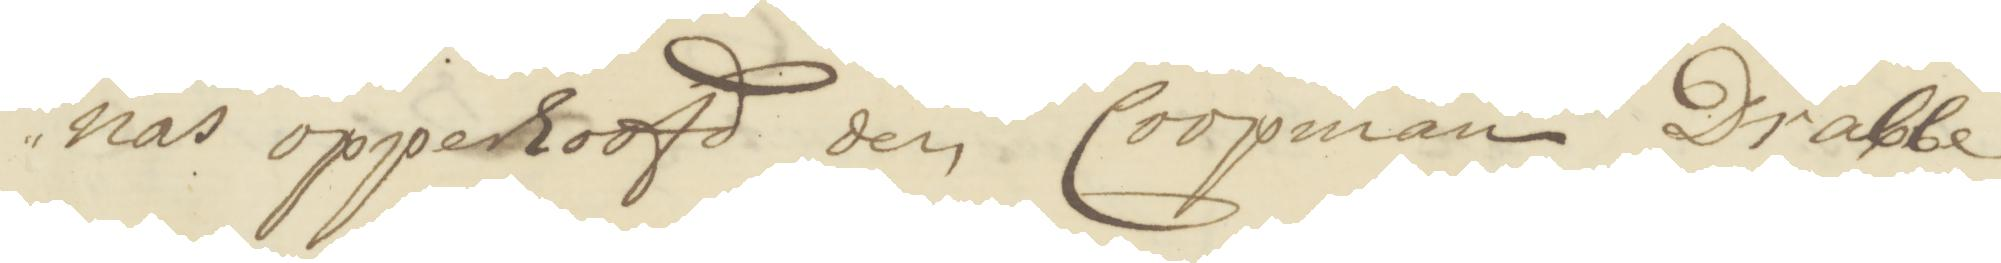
„nas opperhoofd den Coopman Drabbe
